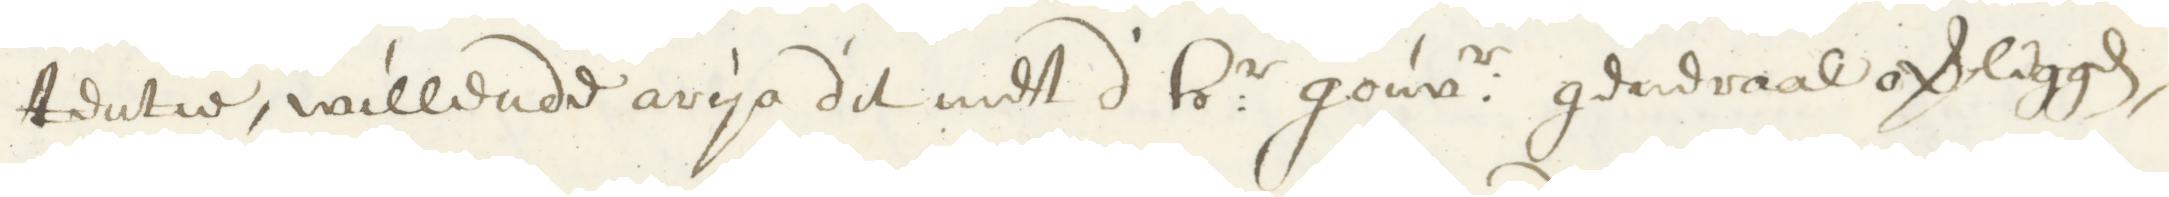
tentie, willende arija dit met d' H:r gouv:r generaal overleggen,
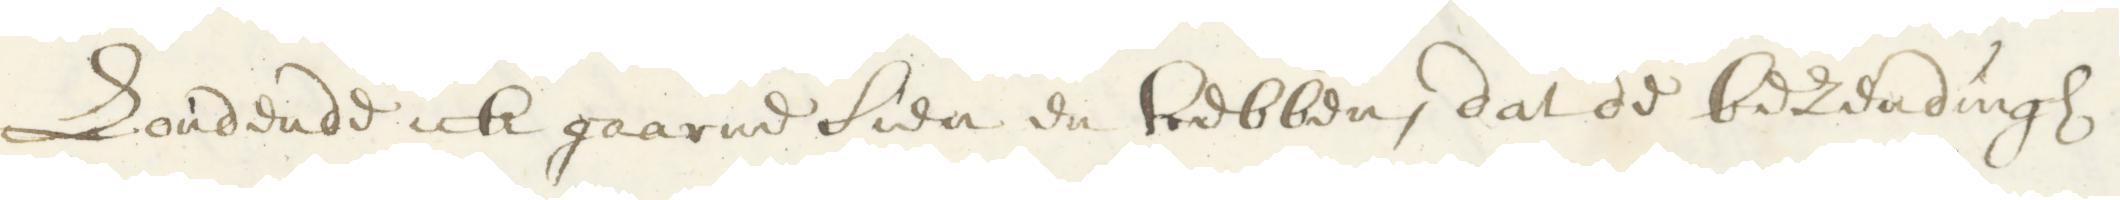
Zoudende ick gaarne sien en hebben, dat de bezendingh
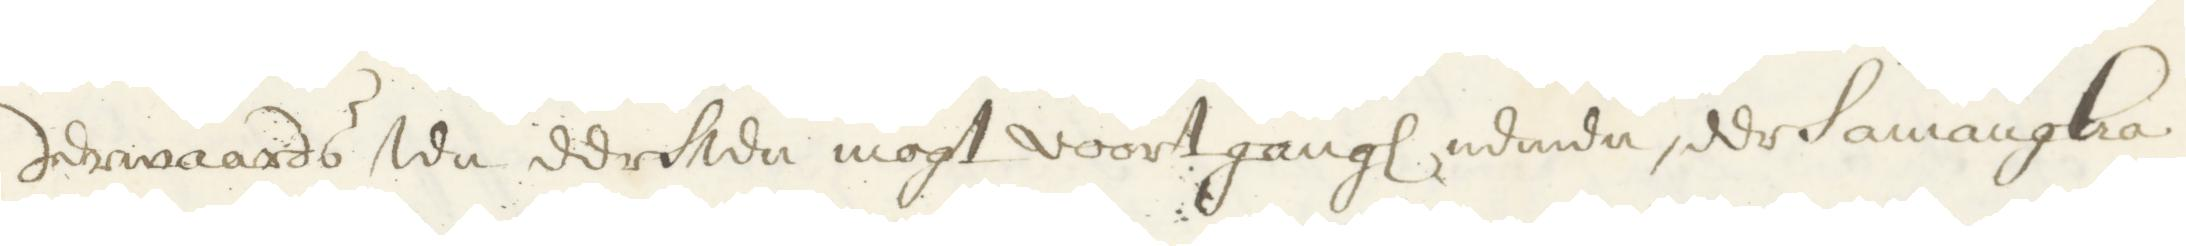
derwaards ten eersten mogt voortgangh nemen, eer samangka
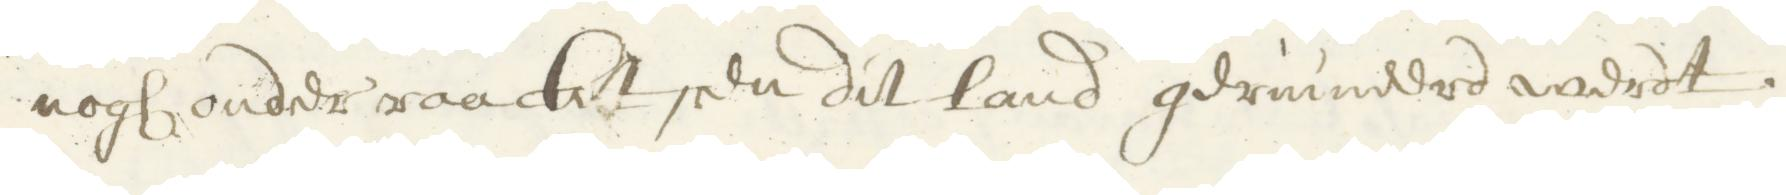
nogh onder raackt, en dit land geruineerd werdt.
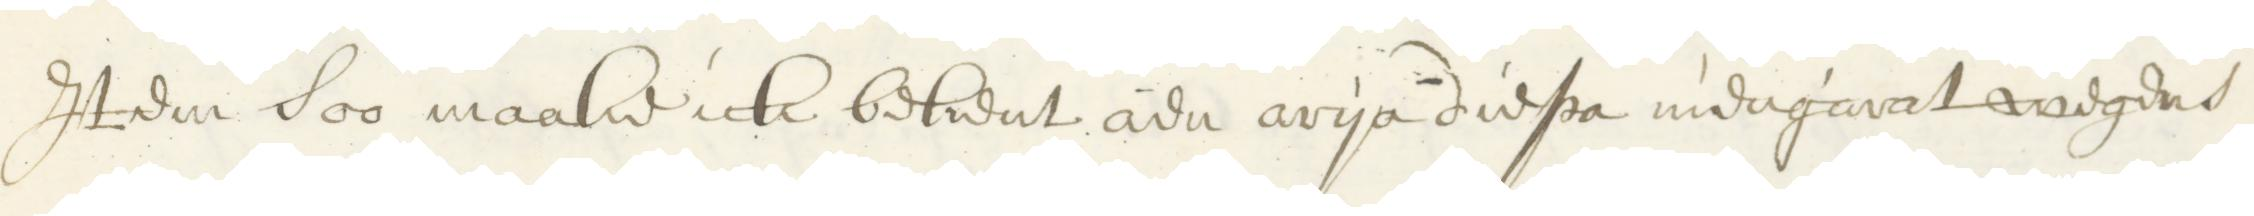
Item soo maake ick bekent aen arija diepa nieng'arat wegens
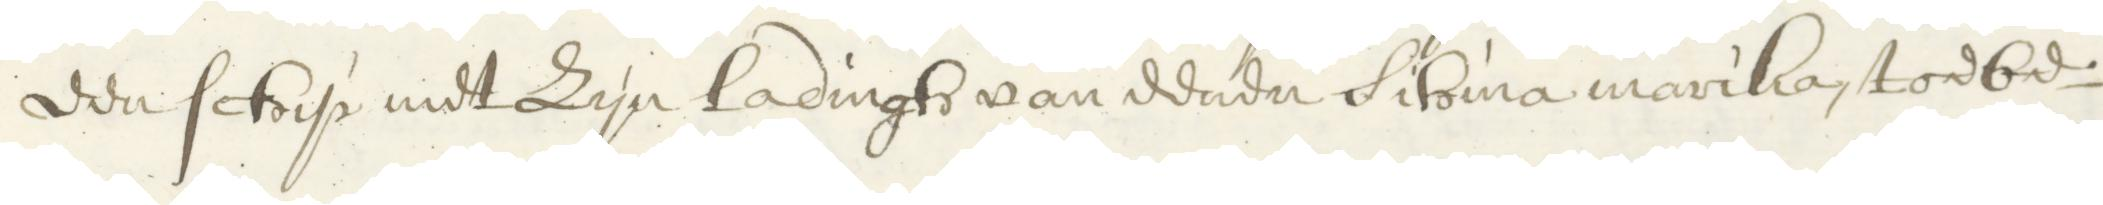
een schip niet zijn ladingh van eenen sihina marika, toebe_
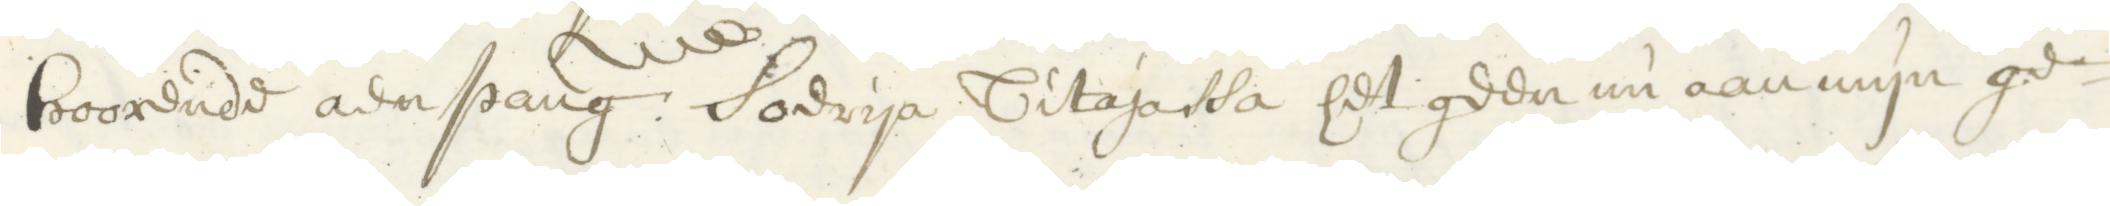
hoorende aen pang: soerija Titajassa het geen nu aan mijn ge=
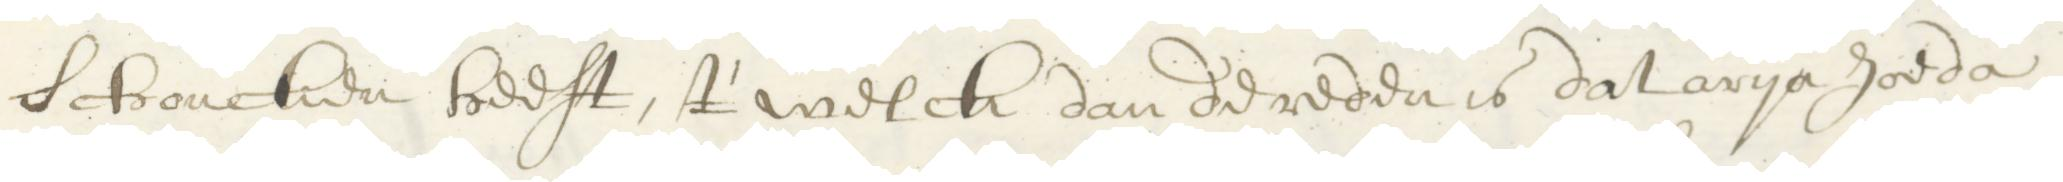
schoncken heeft, t' welck dan de reden is dat arija joeda
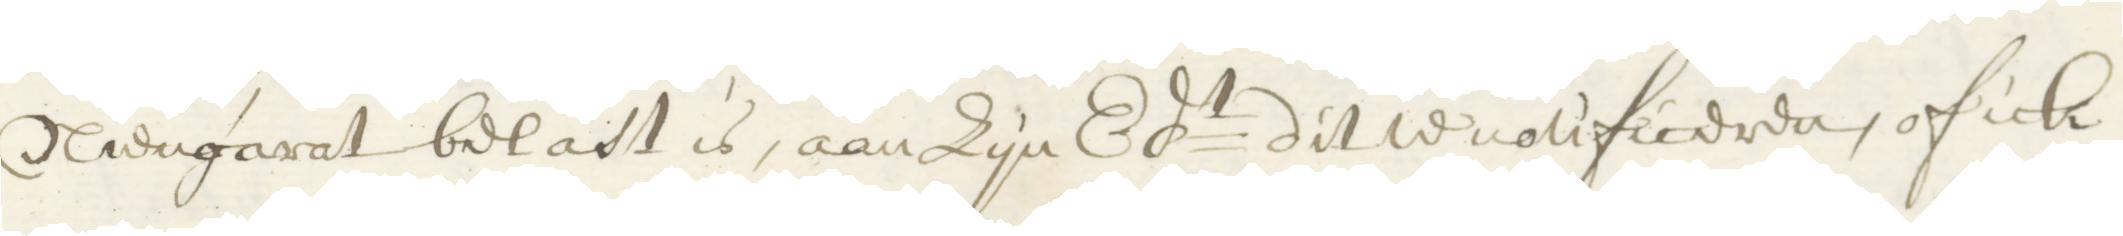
Nieng'arat belast is, aan zijn Ed=t dit te notificeren, of ick
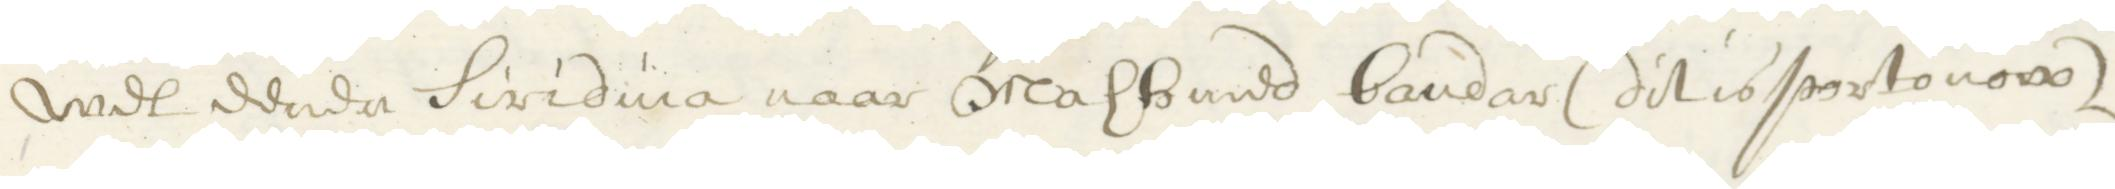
wel eenen siridina naar Machmed bandar (dit is porto novo)
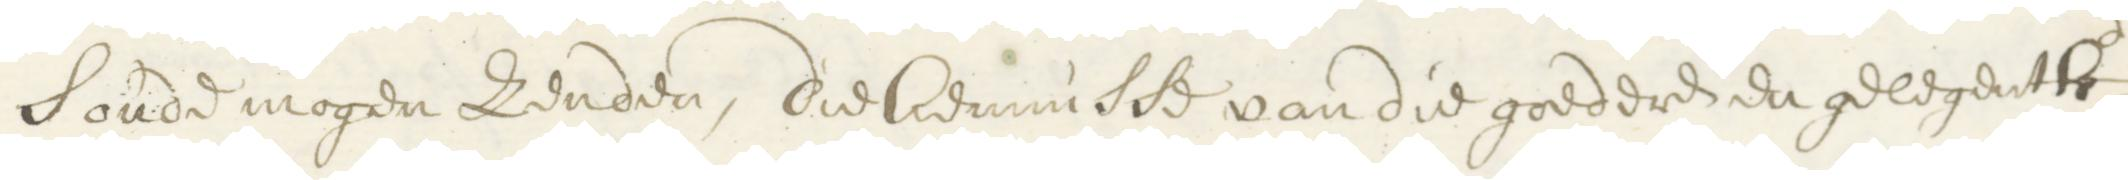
soude mogen zenden, die kennisse van die goederen en gelegenth–d
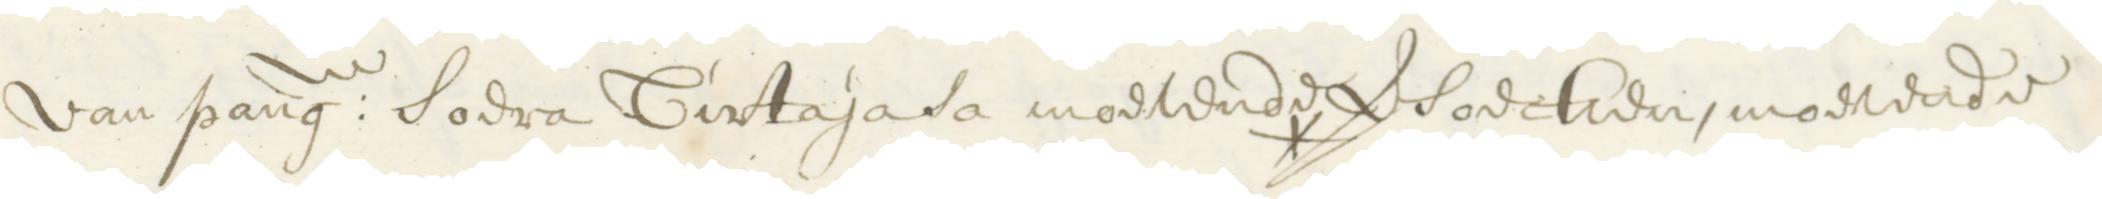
van pang: soera Tirtajasa moetende versoecken, moetende
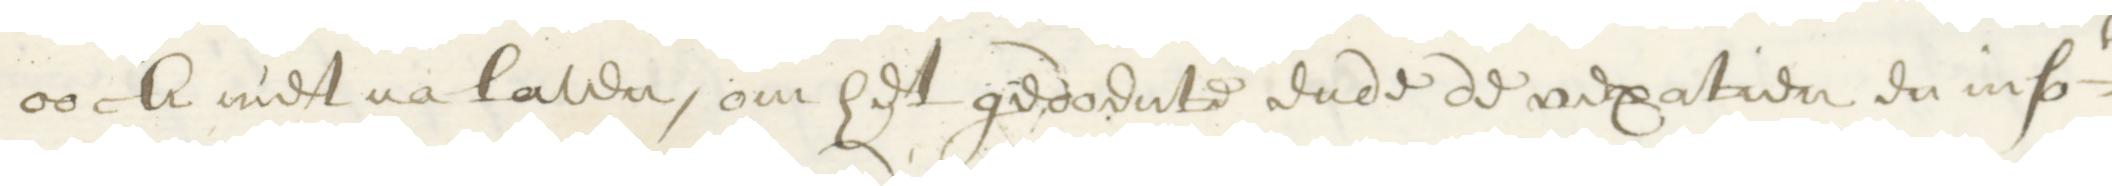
oock niet na laten, om het gedoente ende de repatien en inp=
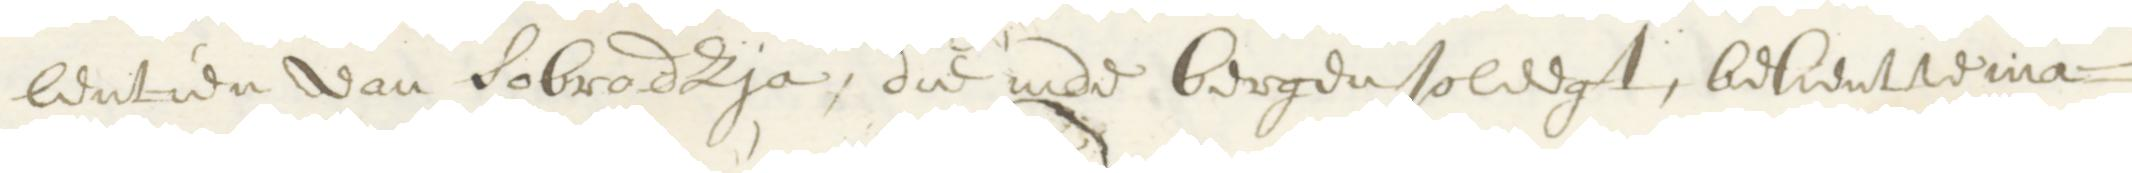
lentien van sobrodzja, die inde bergen pleegt, bekent te mak=
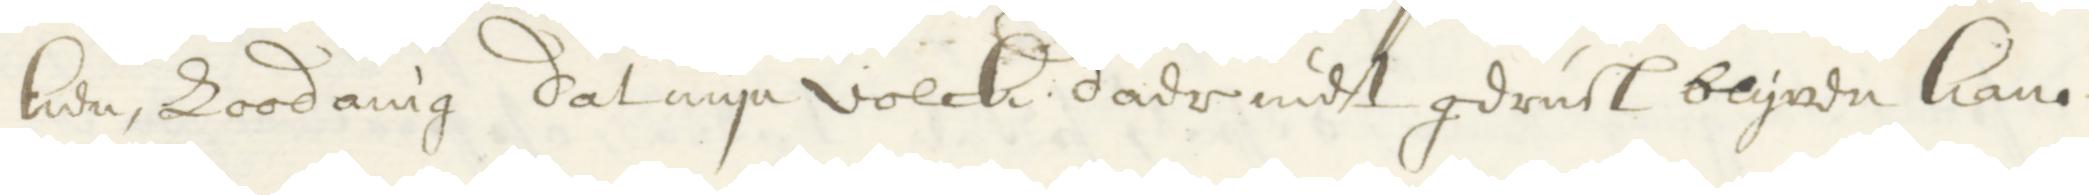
ken, zoodanig dat mijn volck daer niet gerust blijven kan.
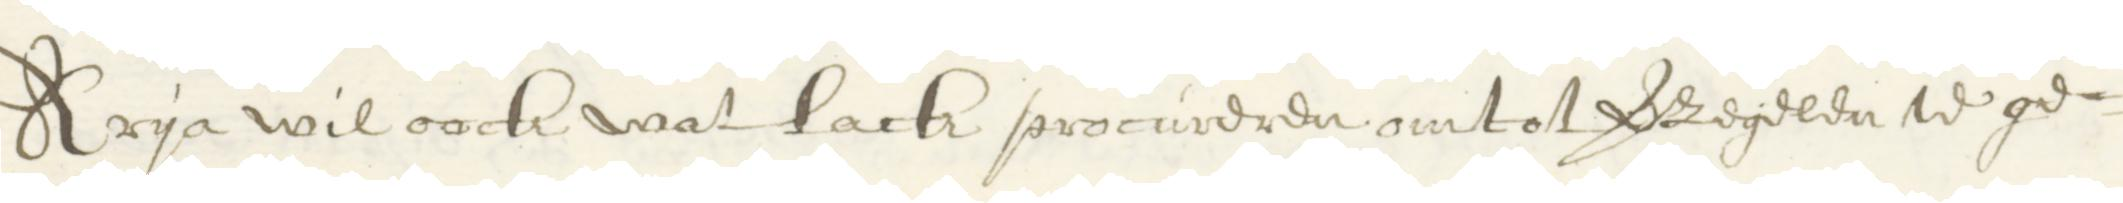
Arija wil oock wat lack procureren omtot verzegelen te ge=
